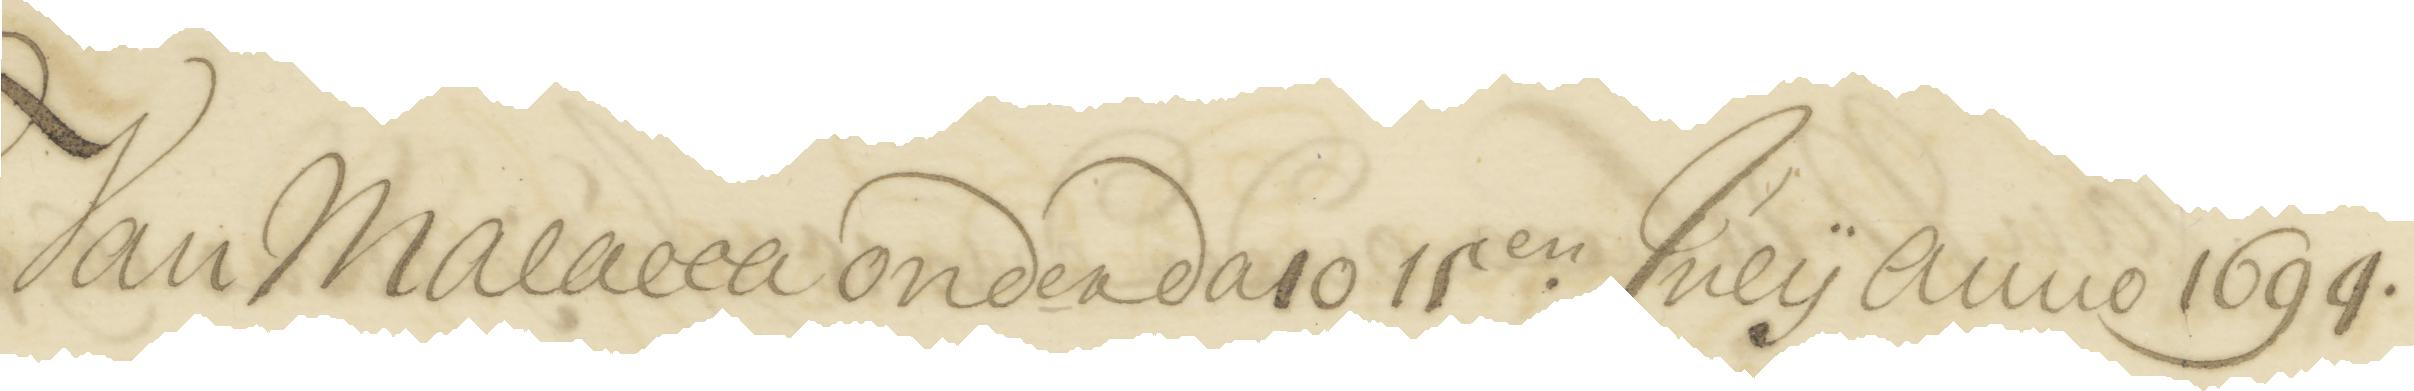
Van Malacca onder dato 15=en Julij anno 1694.
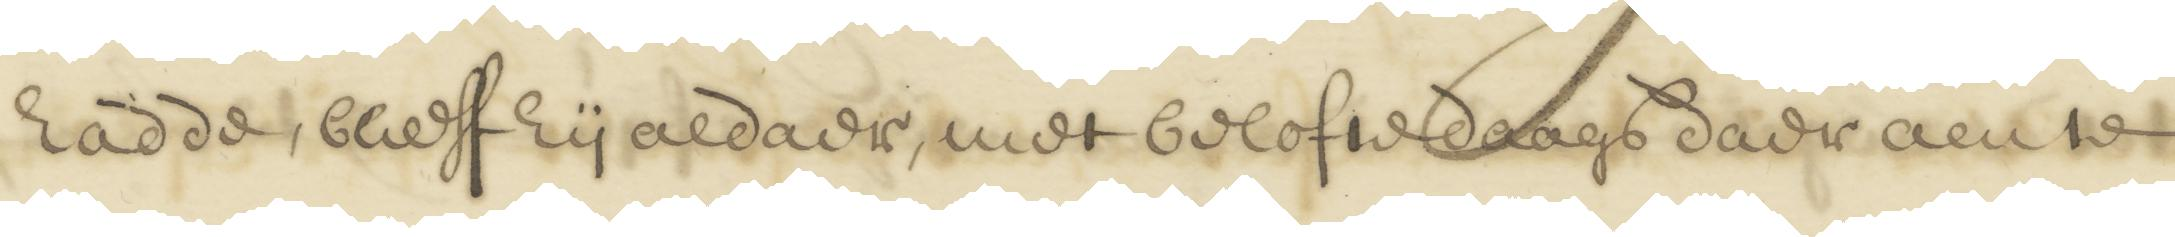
hadde, bleeff hij aldaer, met belofte daags daer aen te
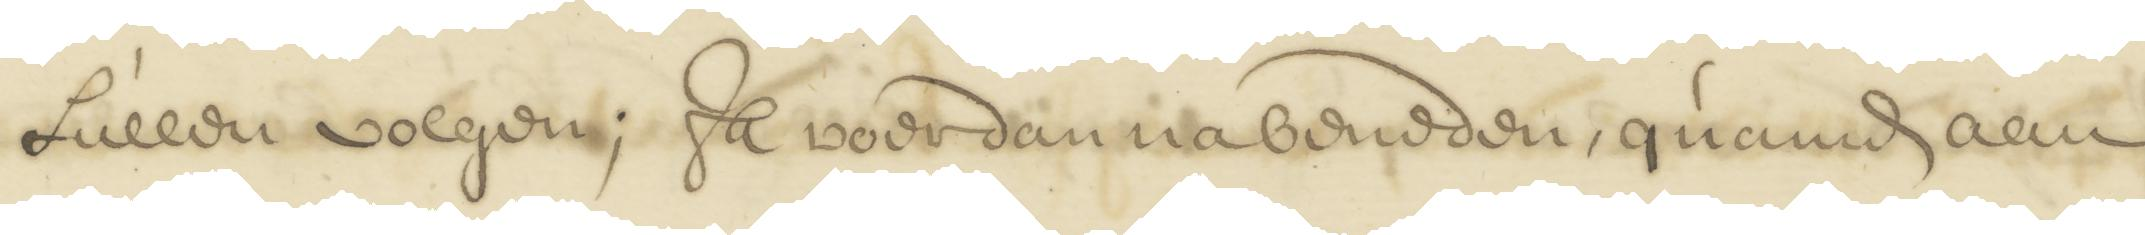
sullen volgen; Jk voer dan nabeneden, quame aen
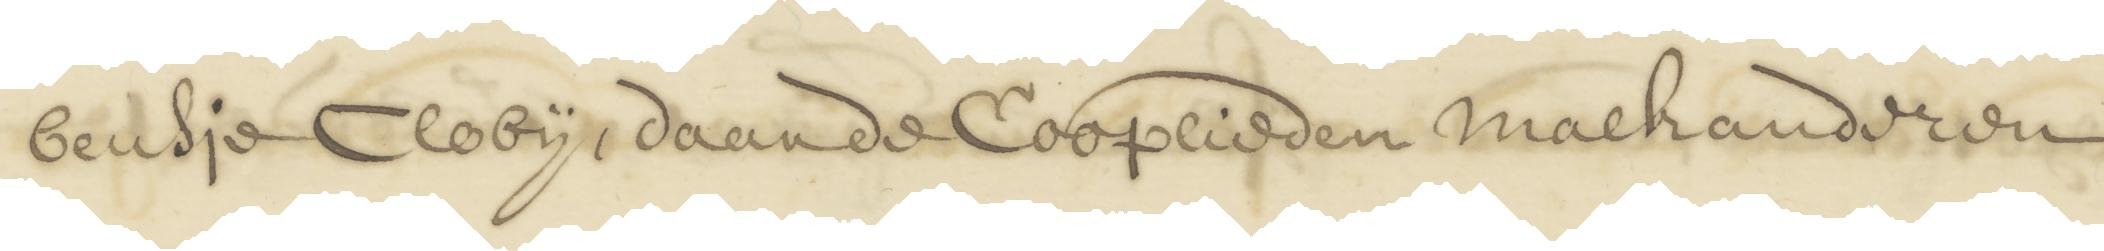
bensje Clobij, daar de Cooplieden malkanderen
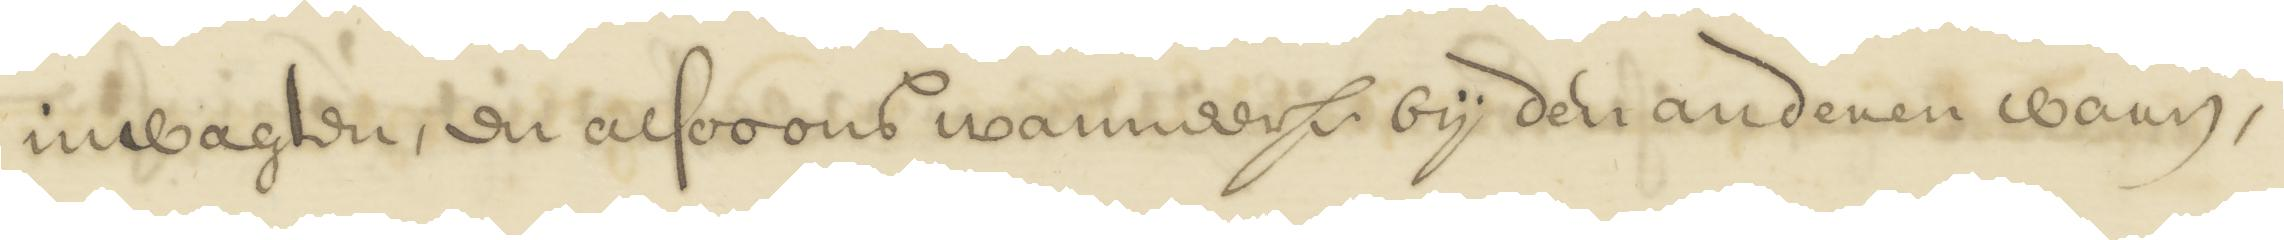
inwagten, en alsoo ons wanneerse bij den anderen waren,
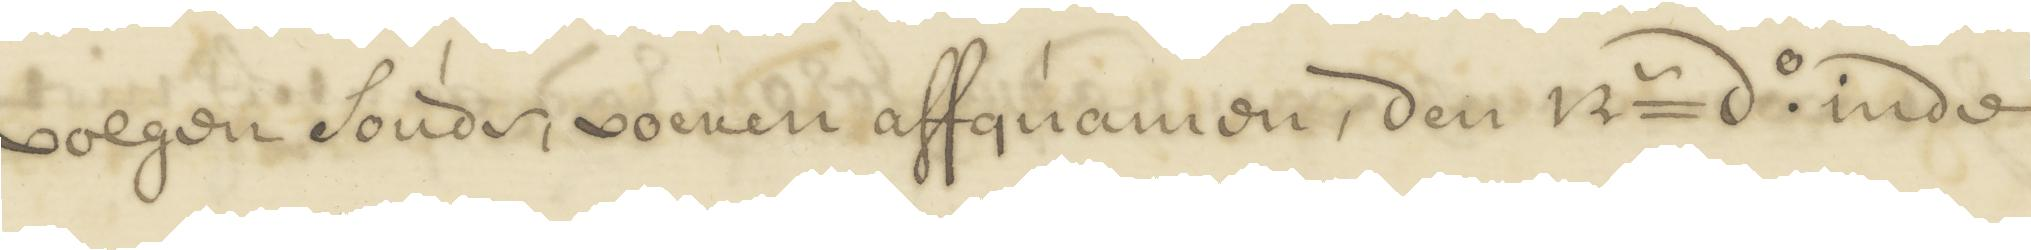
volgen soude, voeren affquamen, den 12=en d=o inde
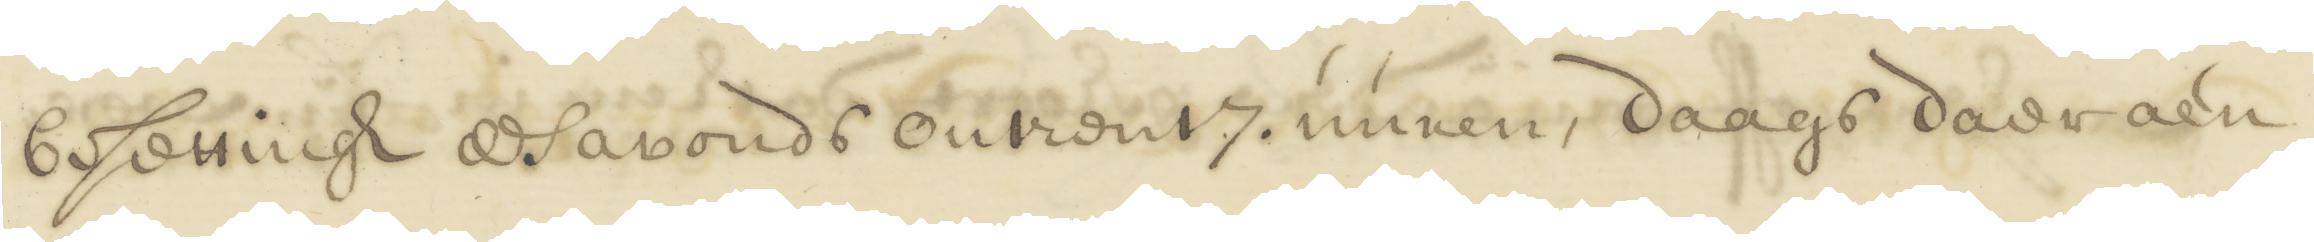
besettingh des avonds ontrent 7. uuren, daags daer aen
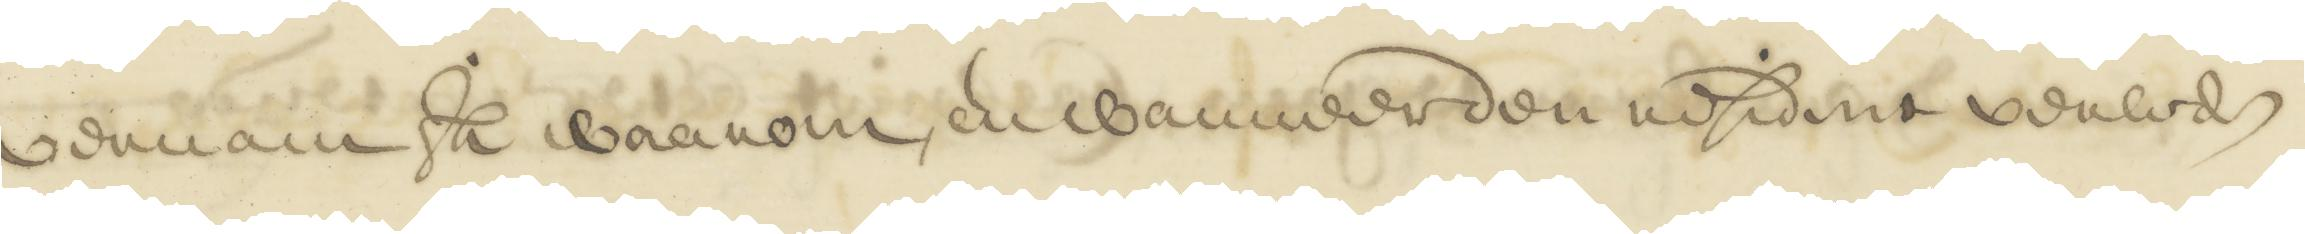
vernam Jk waarom, en wanneer den resident verleden
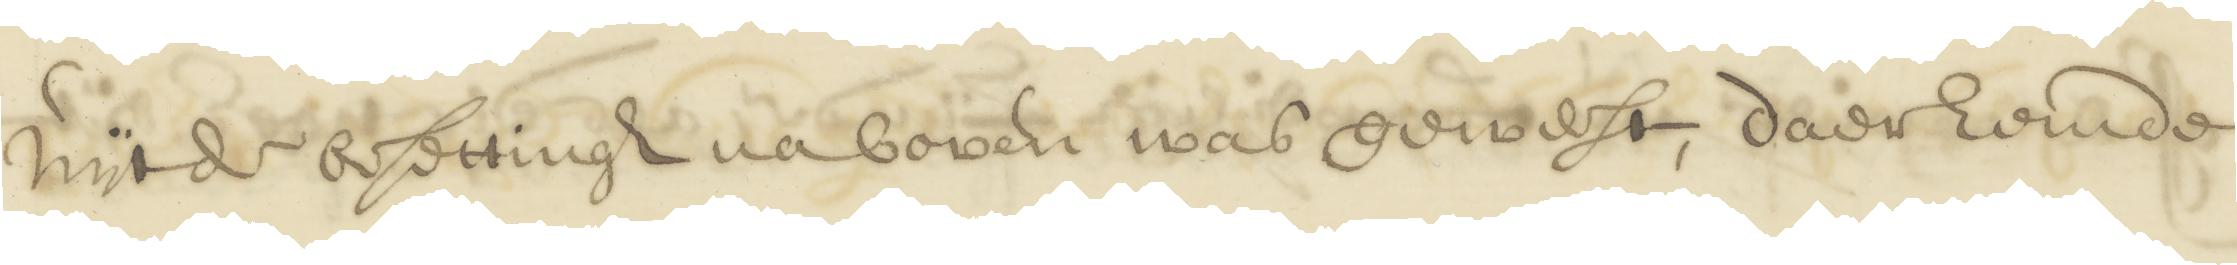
uijt de besettingh na boven was geweest, daer hem de
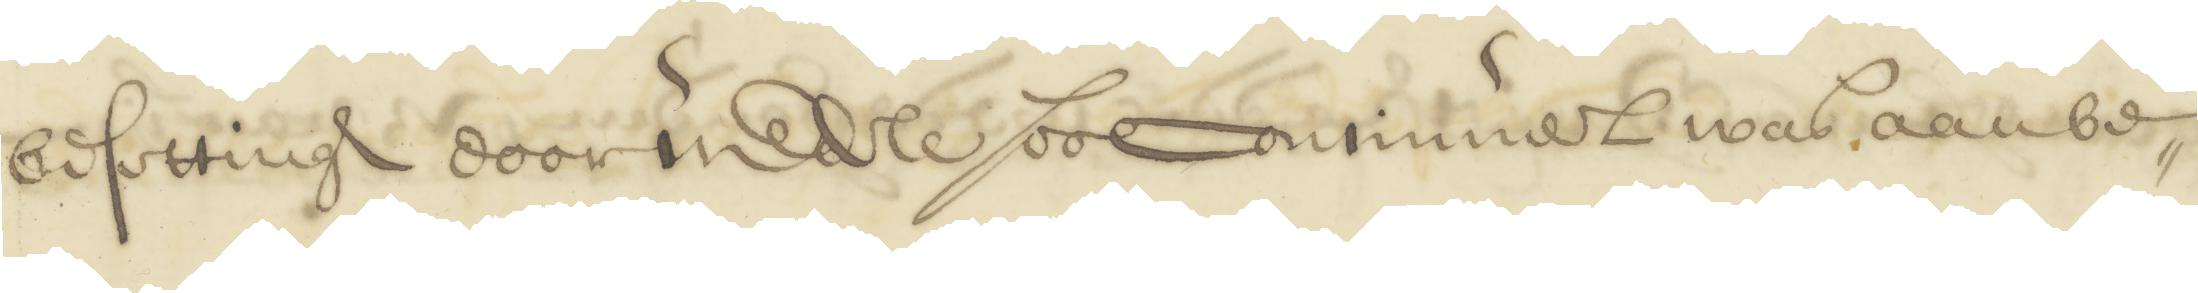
besettingh door u Edele soo Continueel was, aan be„
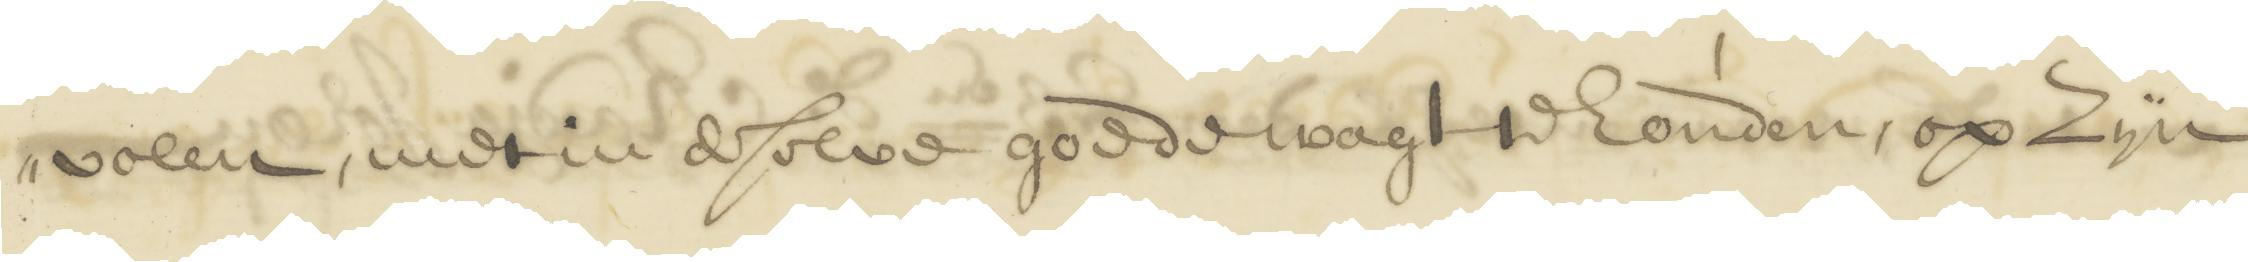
„volen, niet in deselve goede wagt te houden, op Zijn
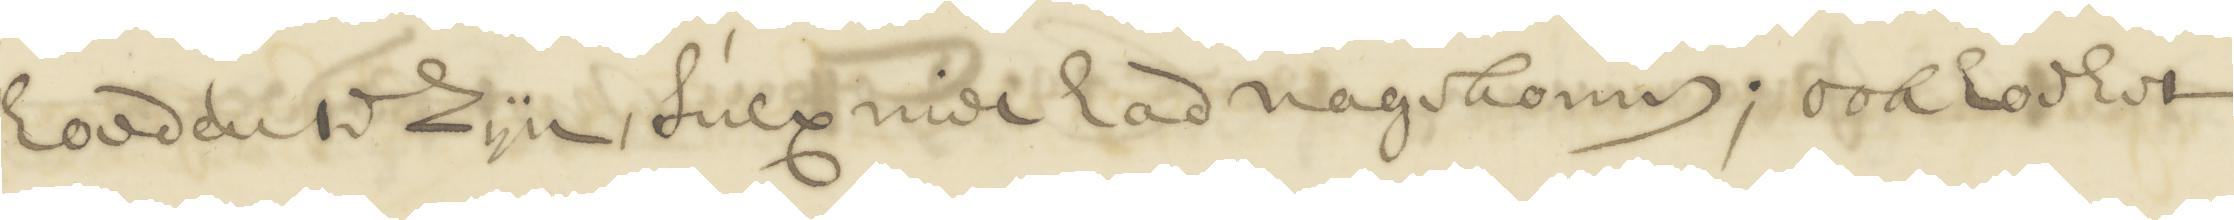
hoeden te Zijn, sulx niet had nagekomen, ook hoe het
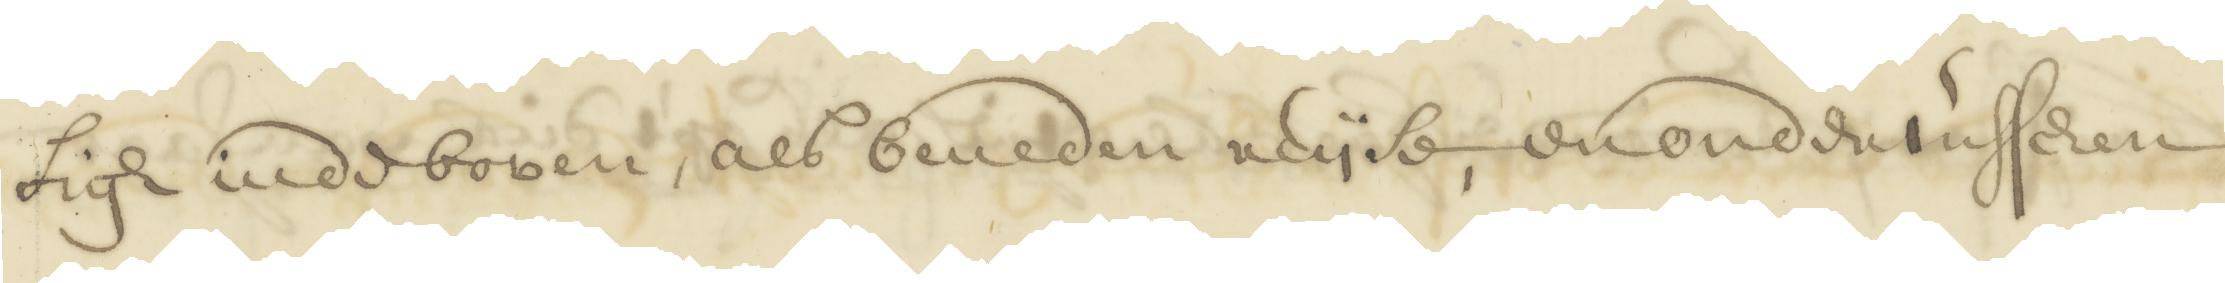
sigh inde boven als beneden reijse, en ondertusschen
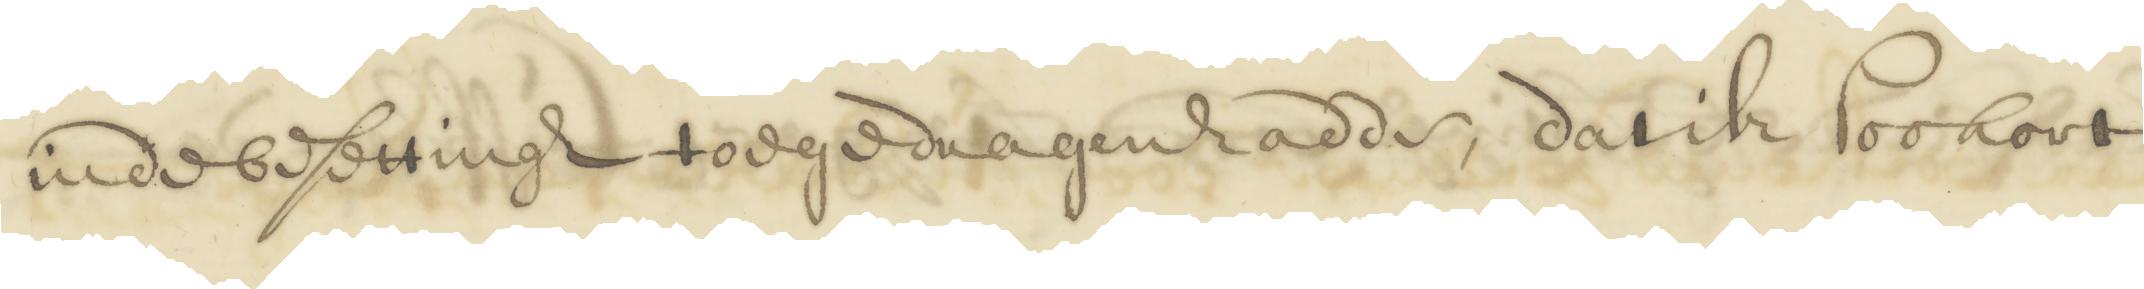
in de besettingh toegedragen hadde, dat ik Soo kort
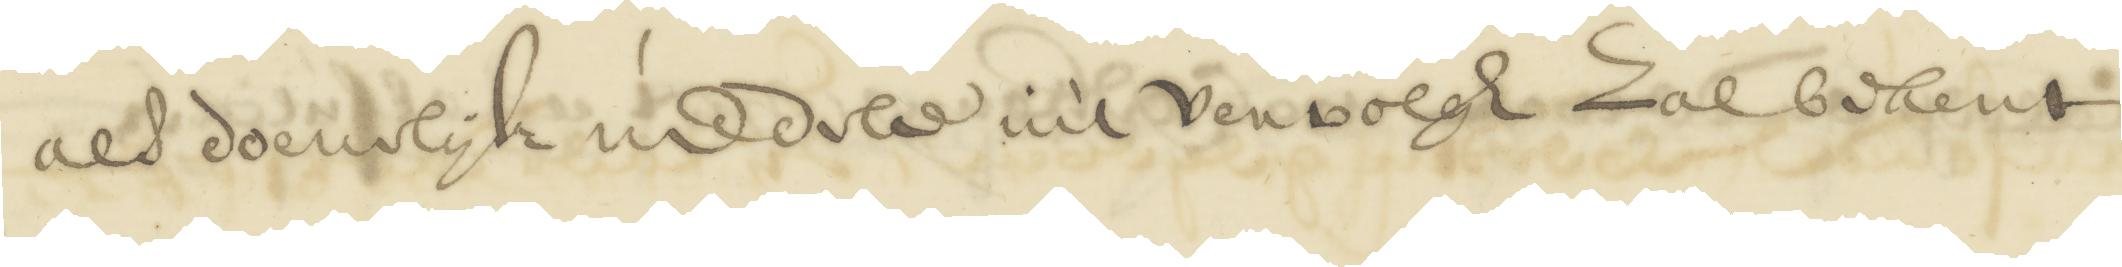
als doenelijk u Edele in 't vervolgh Zal bekent
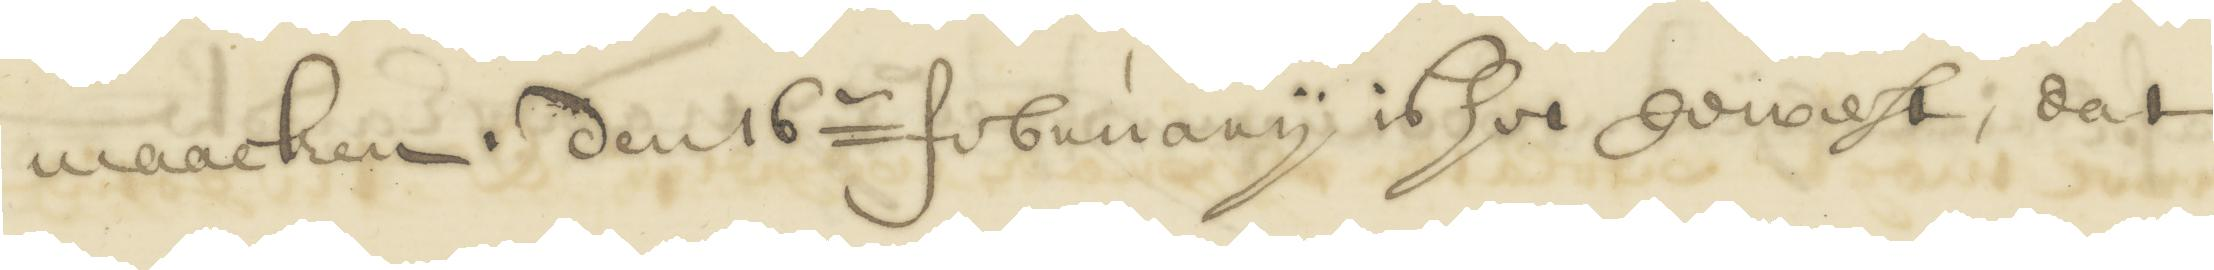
maacken. den 16=en februarij is het gewest, dat
